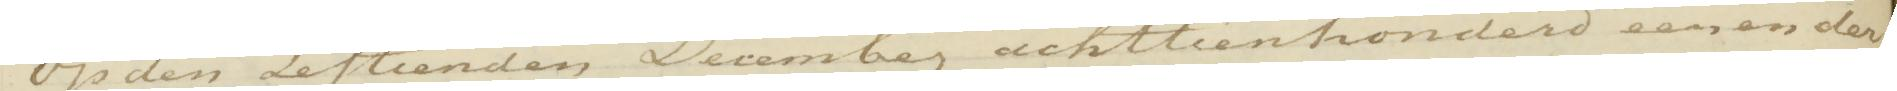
Op den dertienden December achttienhonderd een en der
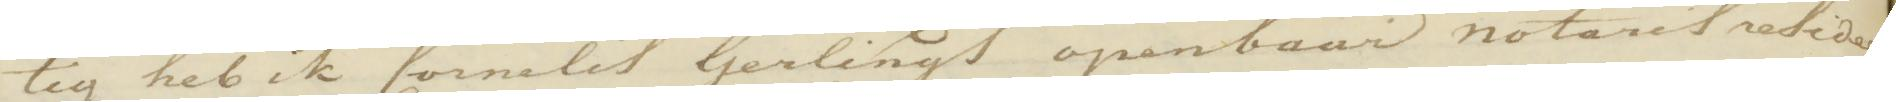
tig heb ik Cornelis Gerlings openbaar notaris residee
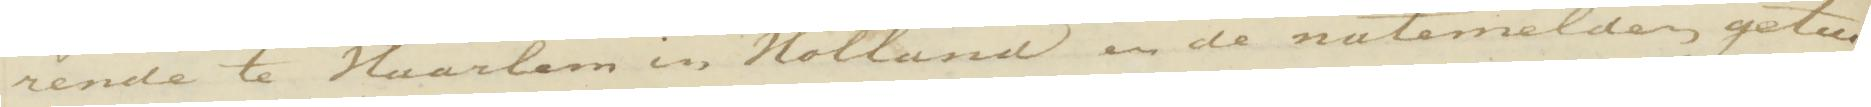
rende te Haarlem in Holland en de natemelden getui
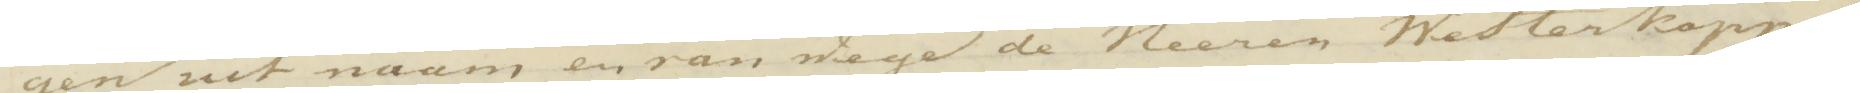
gen uit naam en van wege de Heeren Westerkoppel
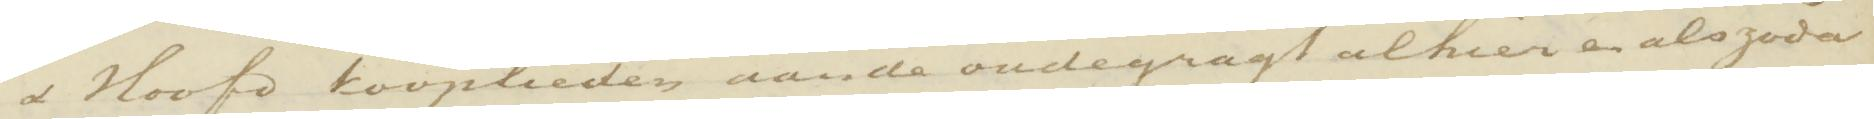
& Hoofd kooplieden aan de oudegragt alhier en als zoda
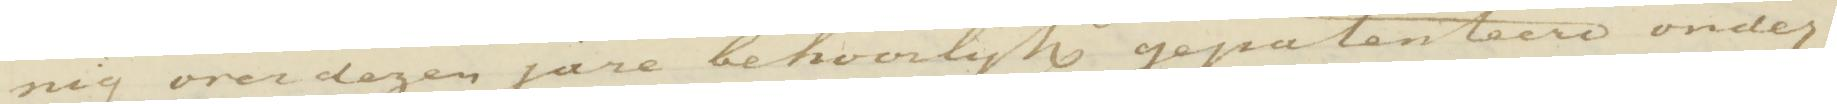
nig over dezen jare behoorlyk gepatenteerd onder
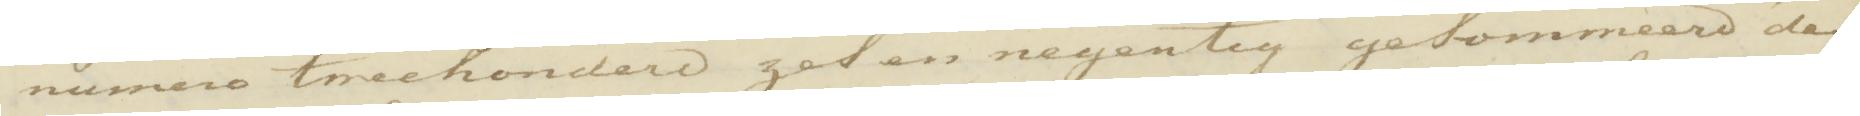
numero tweehonderd zes en negentig gesommeerd den
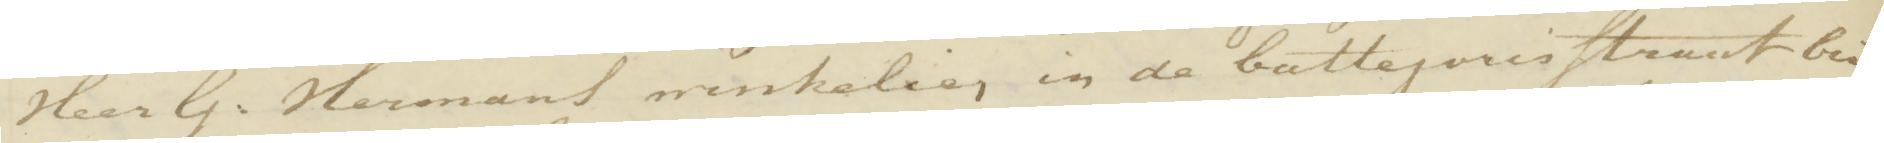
Heer G: Hermans winkelier in de battejorisstraat bin
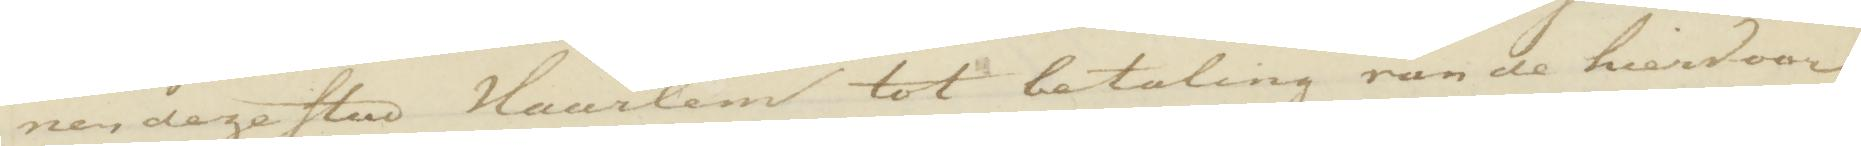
nen deze stad Haarlem tot betaling van de hiervoor
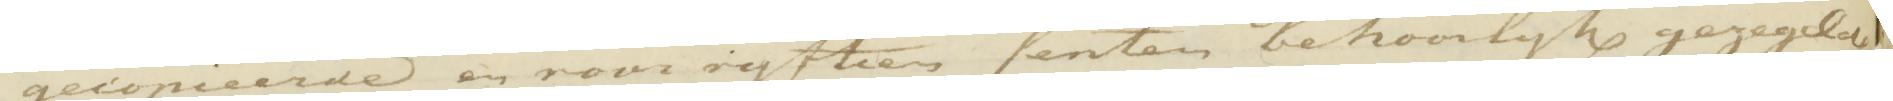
gecopieerde en voor vyftien Centen behoorlyk gezegelde
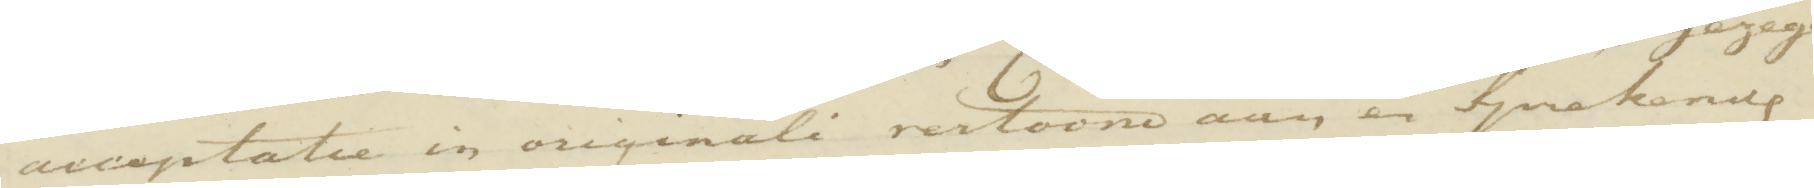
acceptatie in originali vertoond aan en sprekende
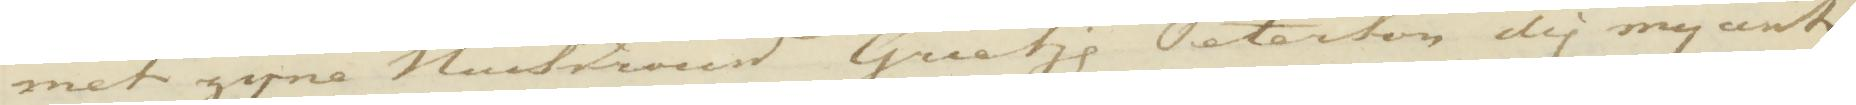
met zyne Huisvrouw Greetje Petersen die my ant-
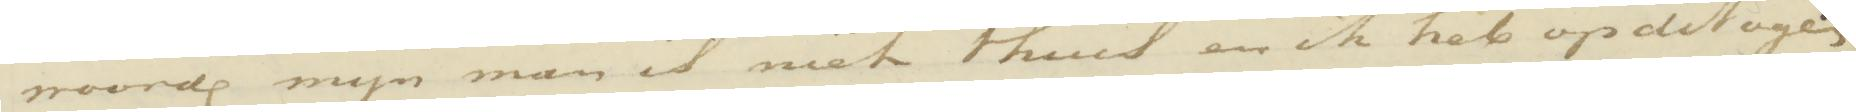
woorde myn man is niet thuis en ik heb op dit ogen
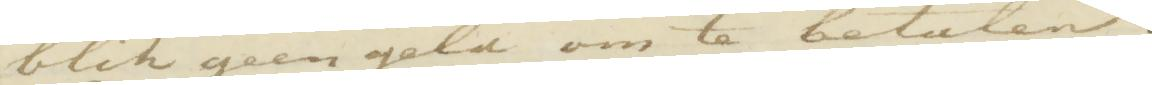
blik geen geld om te betalen.
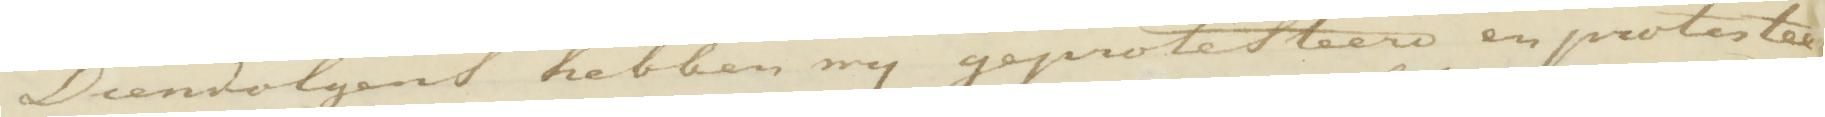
Dienvolgens hebben wy geprotesteerd en protestee
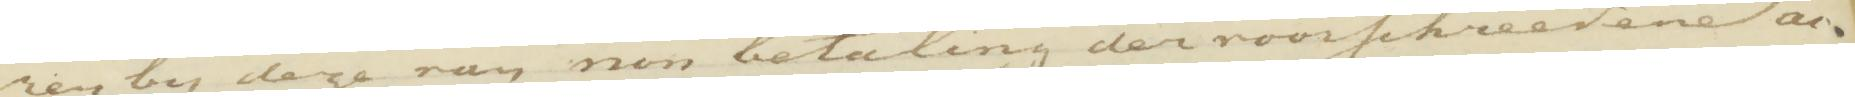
ren by deze van non betaling der voorschreevene ac.
